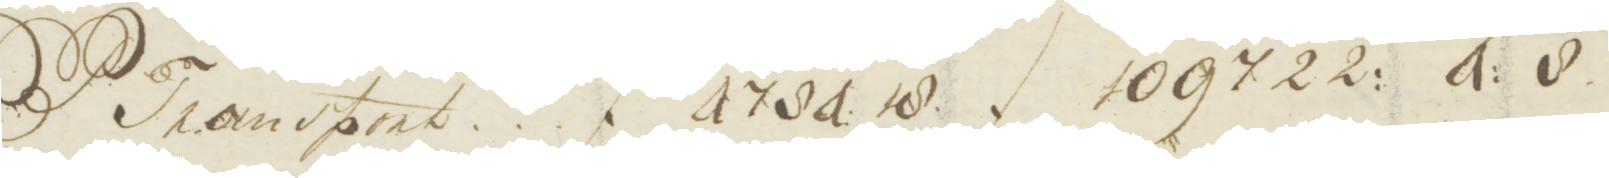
P Transport . . . ƒ 4784: 18: ƒ 109722: 4: 8
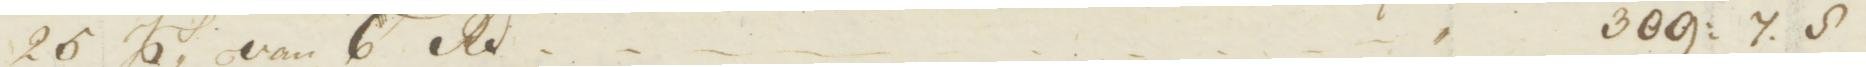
25 p„s van 6 Rd - - - - - - - - - - - „ 309: 7. 8
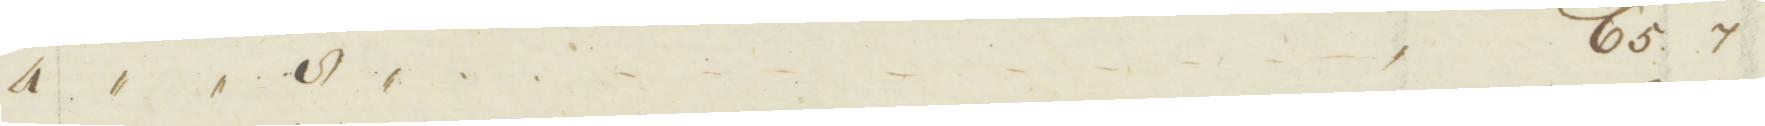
4 „ „ 8 „ - - - - - - - - - - - „ 65. 7
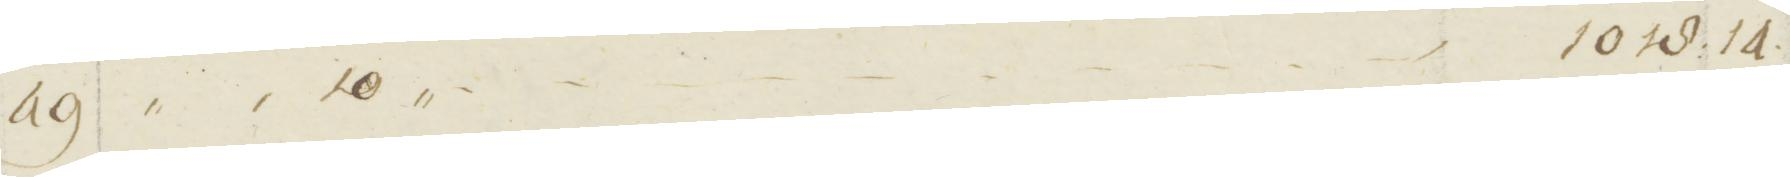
49 „ „ 10 „ - - - - - - - - - - - „ 1018: 14.
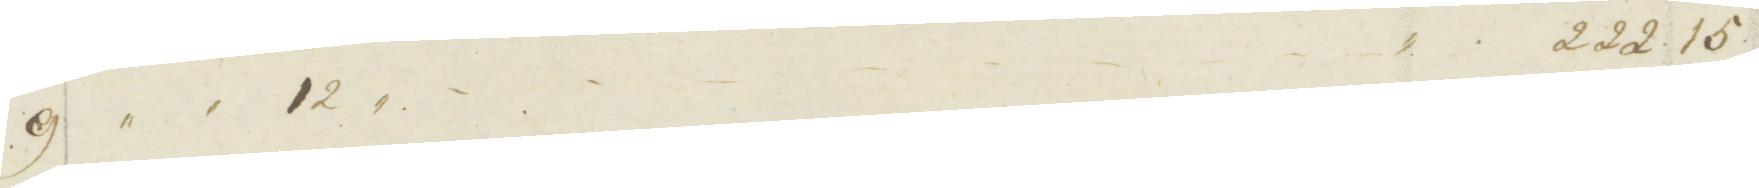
9 „ „ 12 „ - - - - - - - - - „ 222: 15:
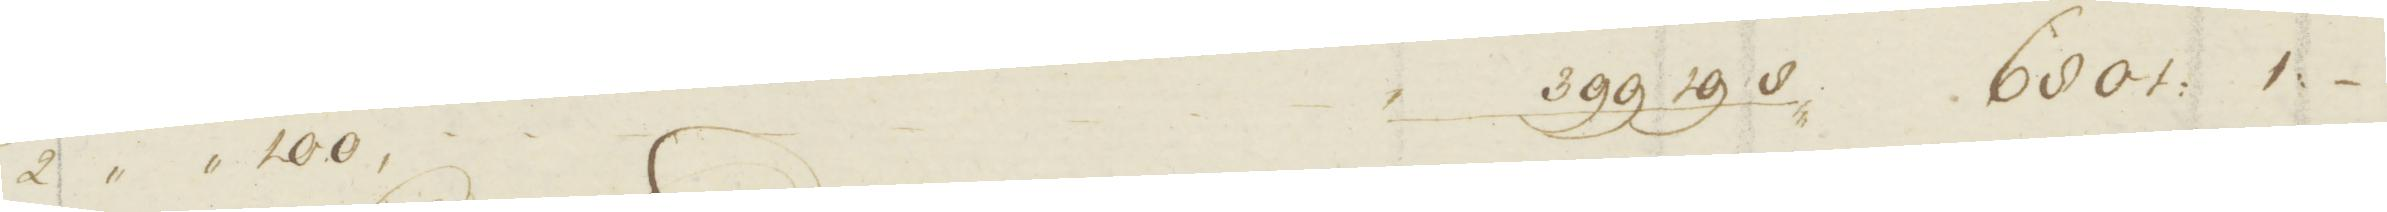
2 „ „ 100 „ - - - - - - - - - „ 399 19: 8„ 6801: 1: —
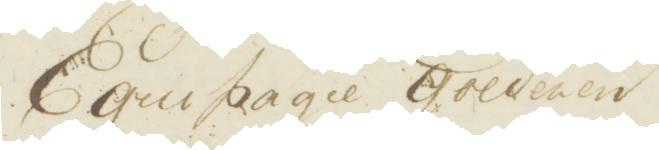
Equipagie goederen
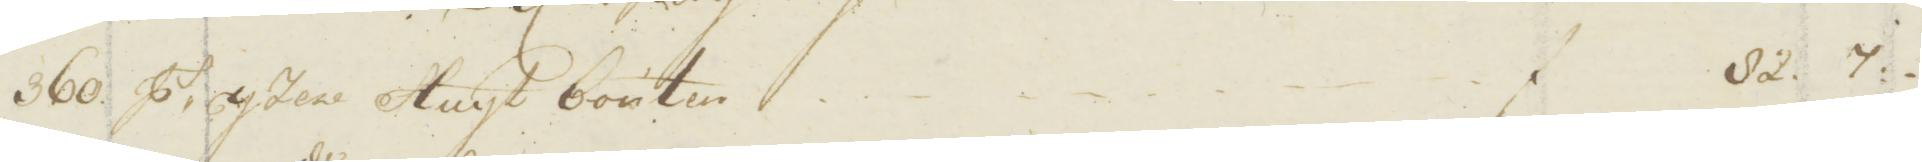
360 p„s ijzere sluyt bouten - - - - - - - - - - - ƒ 82. 7:
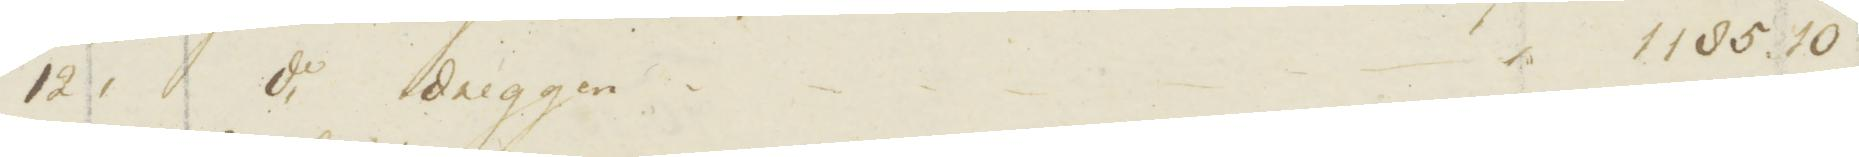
12 „ d„o dreggen - - - - - - - „ 1185:10
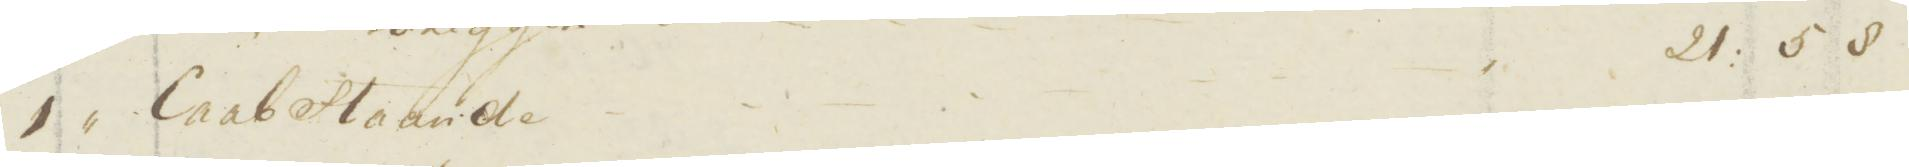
1 „ Caab staande - - - - - - - - - „ 21: 5 8
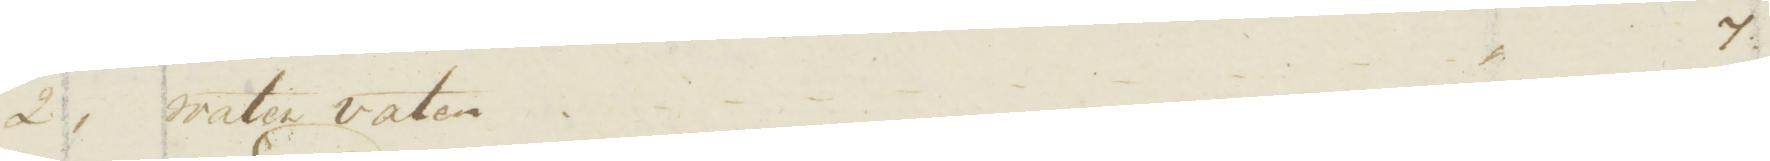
2 „ water vaten - - - - - - - - - - „ 7:
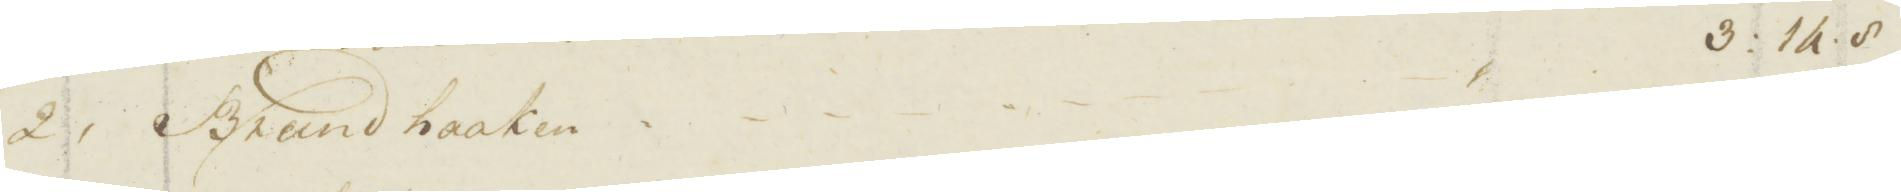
2 „ Brand haaken - - - - - - - - - - - „ 3: 14. 8
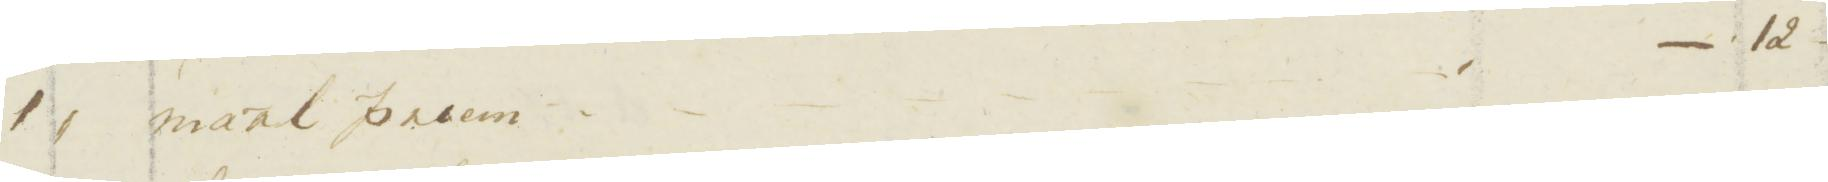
1 „ maal priem - - - - - - - - - „ — . 12
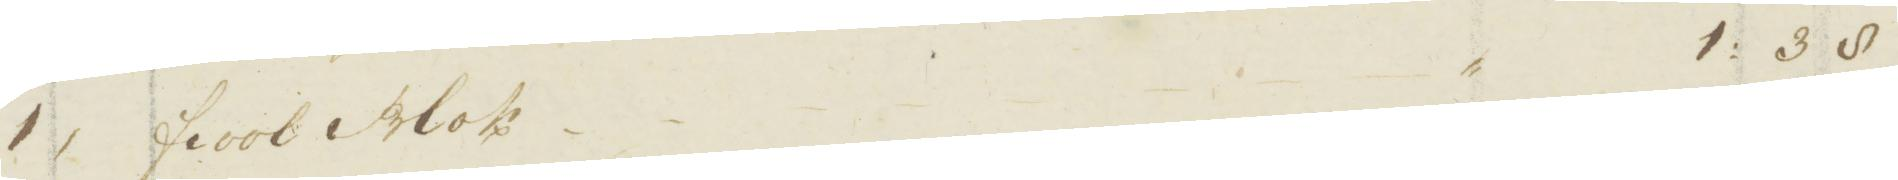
1 „ fiool Blok - - - - - - - - „ 1: 3 8
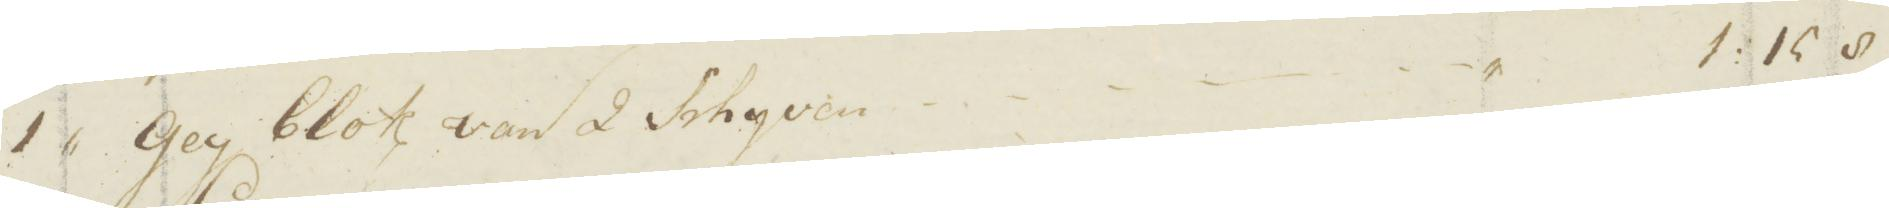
1 „ gey blok van 2 schijven - - - - - - - „ 1: 15 8
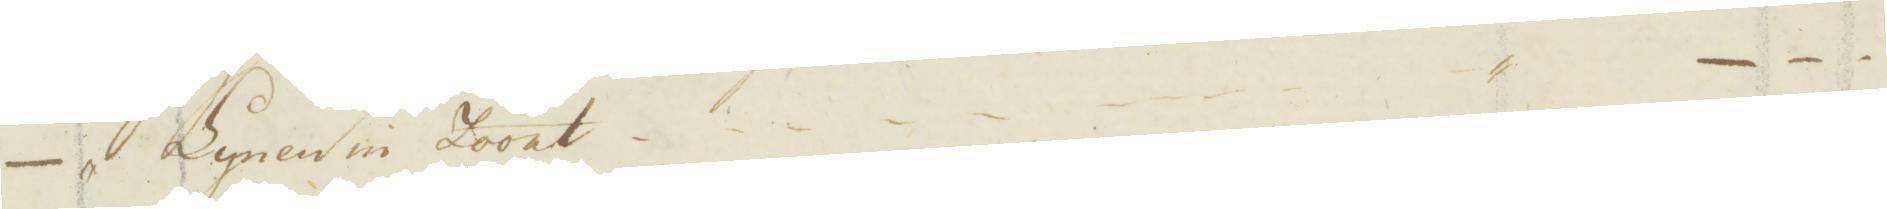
— „ Lynen in zoort - - - - - - - - - - - „ — — -
